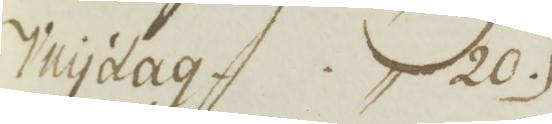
Vrijdag - - „ 20.
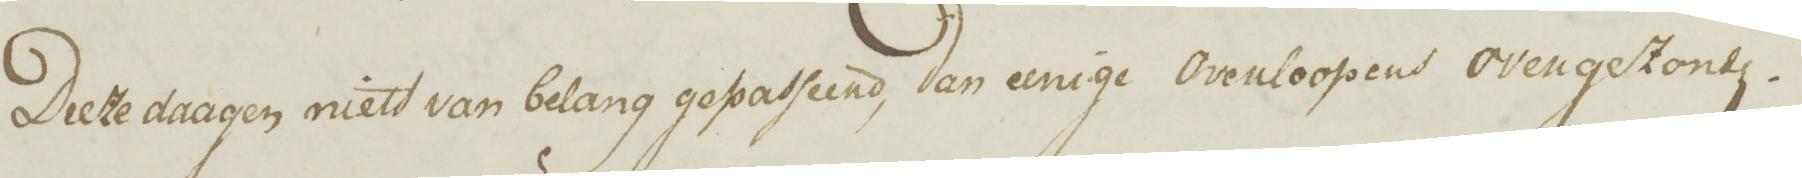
Deeze daagen niets van belang gepasseerd, dan eenige Overloopers overgezonden.
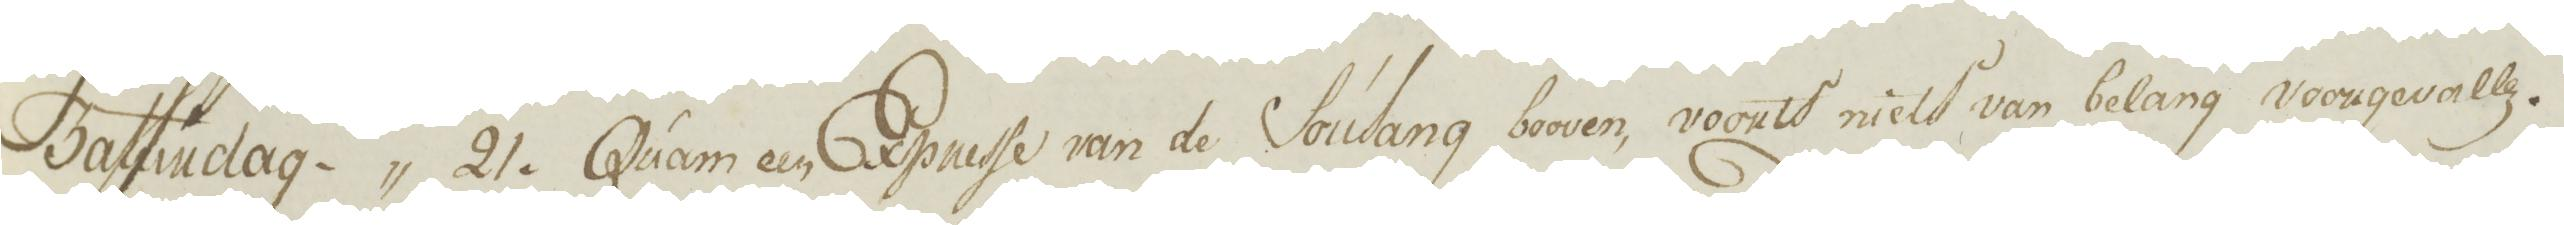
Saturdag - „ 21. Quam een Expresse van de sousang booven, voorts niets van belang voorgevallen.
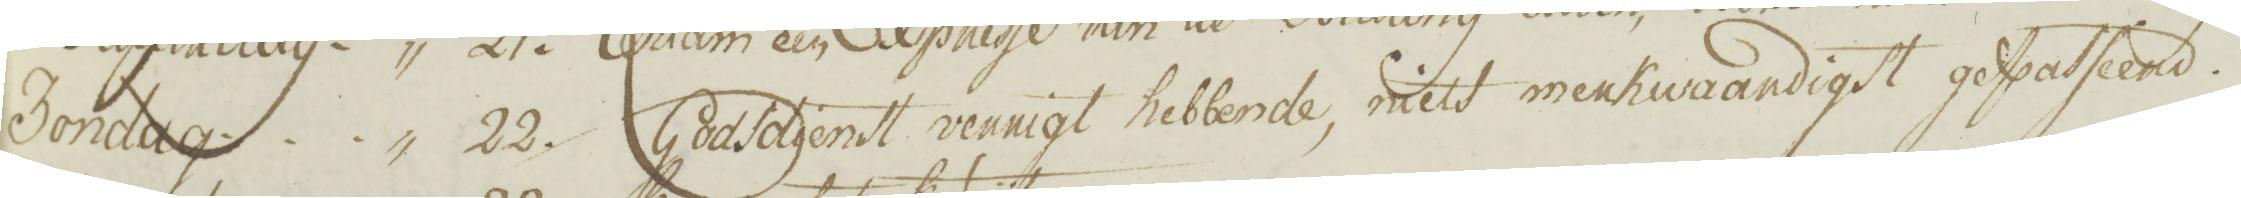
Sondag - - - „ 22. Godsdienst verrigt hebbende, niets merkwaardigst gepasseerd.
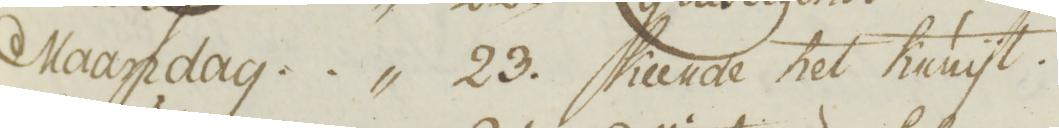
Maandag - - „ 23. keerde het kruijt.
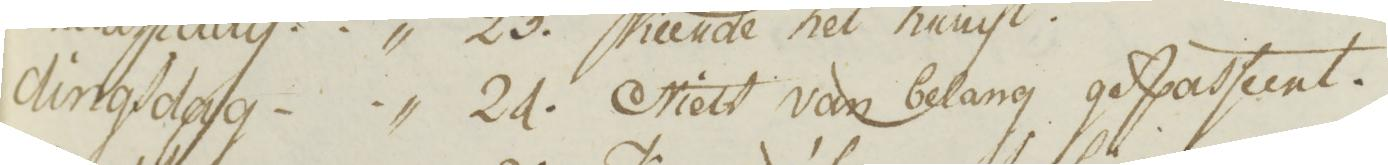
dingsdag - - „ 24. Niets van belang gepasseert.
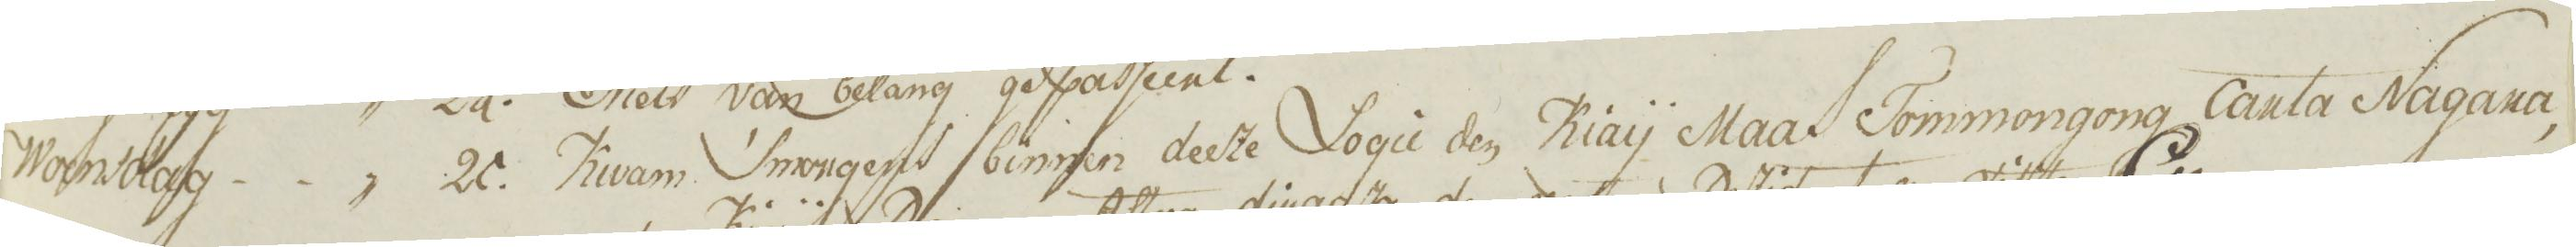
Woensdag - - „ 25. Kwam 'smorgens binnen deeze Logie den Kiaij Maas Tommongong Carta Nagara,
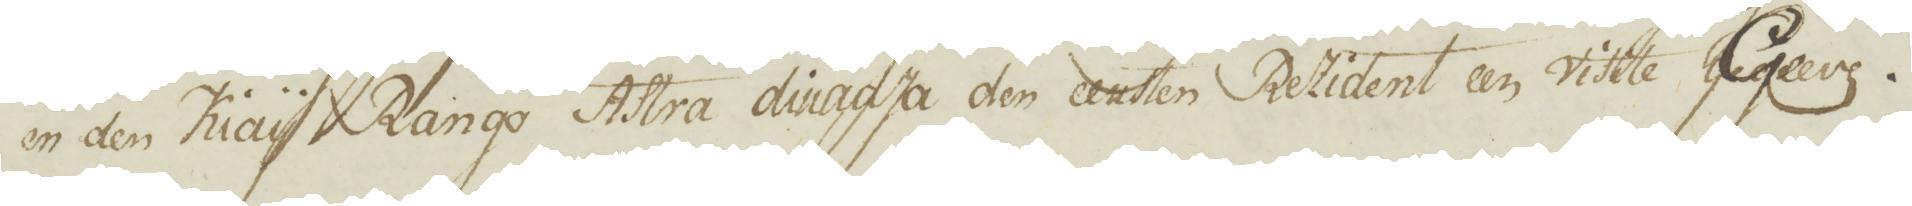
en den Kiaij Rangs Astra diradja den eersten Rezident een visite Geeven.
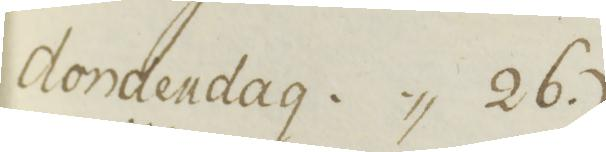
donderdag - - „ 26.
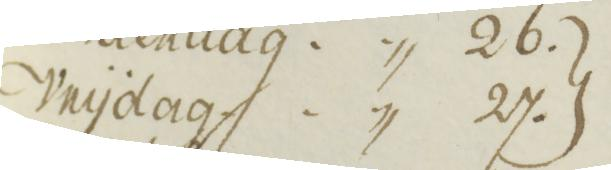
Vrijdag - - „ 27.
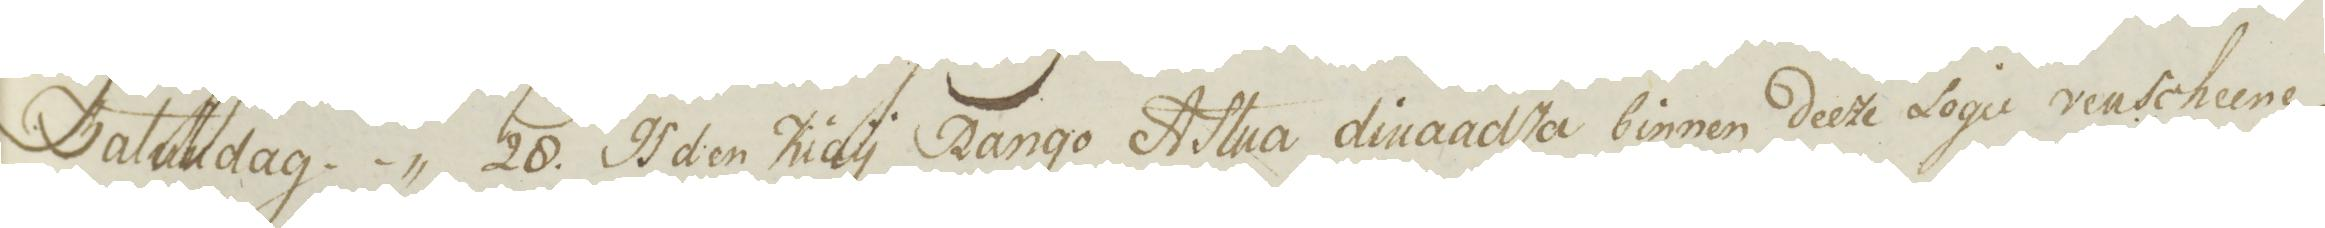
Saturdag - - „ 28. Is den kiaij Rango Astra diraadja binnen deeze Logie verscheenen.
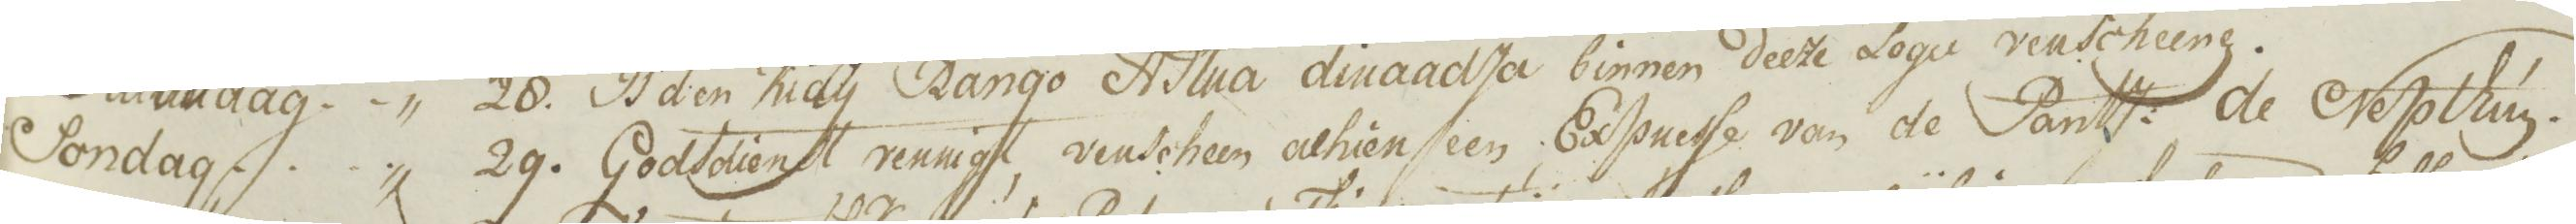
Sondag - - - „ 29. Godsdienst verrigt, verscheen alhier een Expresse van de Pantj: de Nepthun.
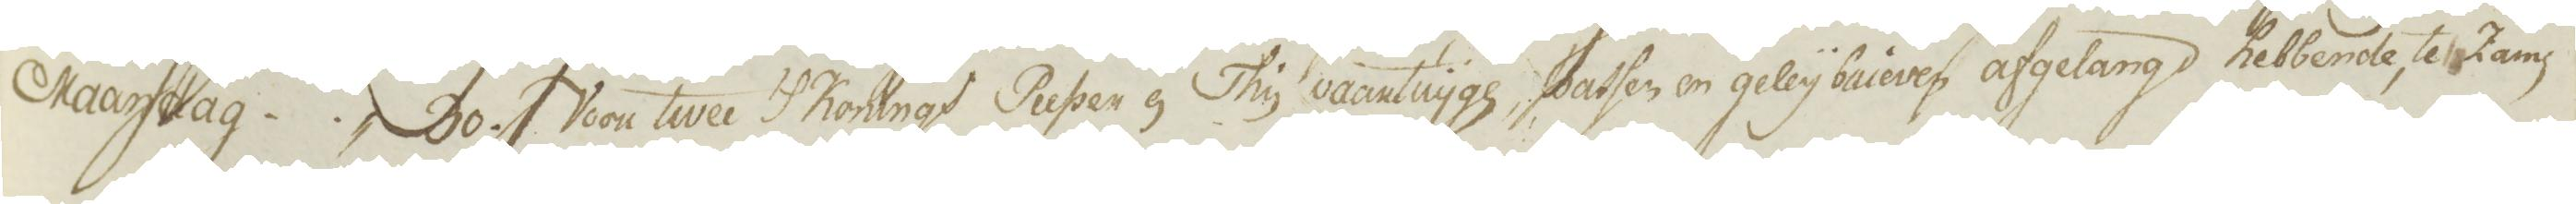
Maandag - - „ 30. Voor twee 's Konings Peeper en Thin vaartuijgen, passen en geleijbrieven afgelangd hebbende, te zamen
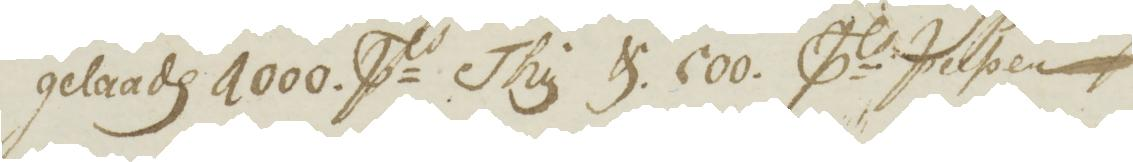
gelaaden 4000. p=ls Thin &. 500. p=ls peeper
